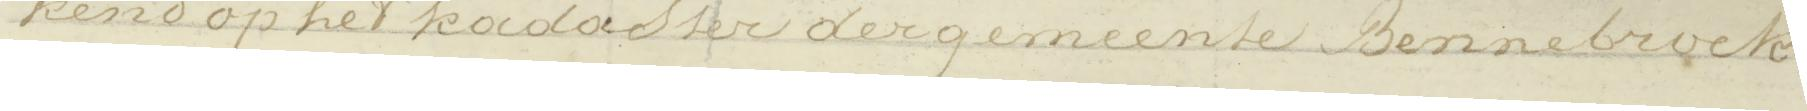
kend op het kadaster der gemeente Bennebroek
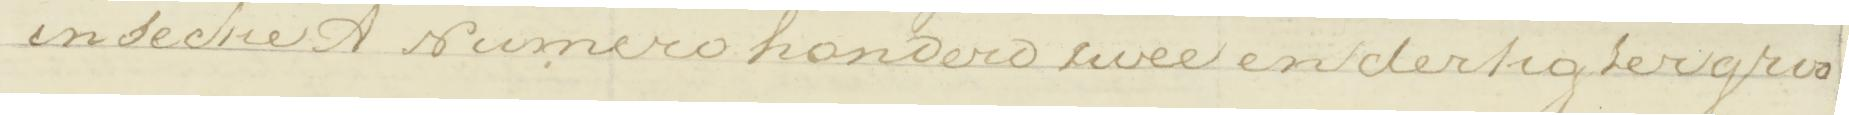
in sectie A Numero honderd twee en dertig ter groo
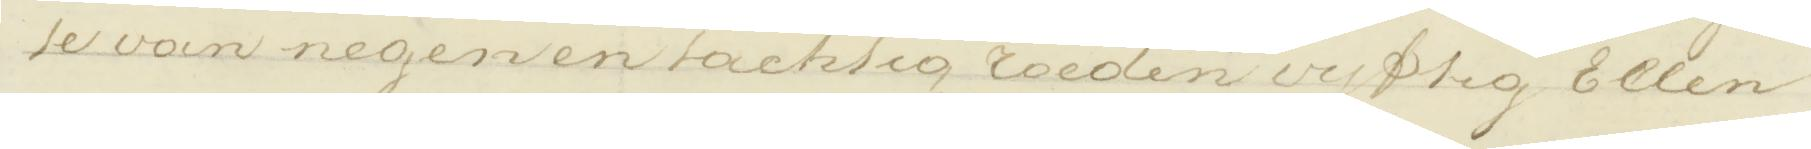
te van negen en tachtig roeden vyftig Ellen
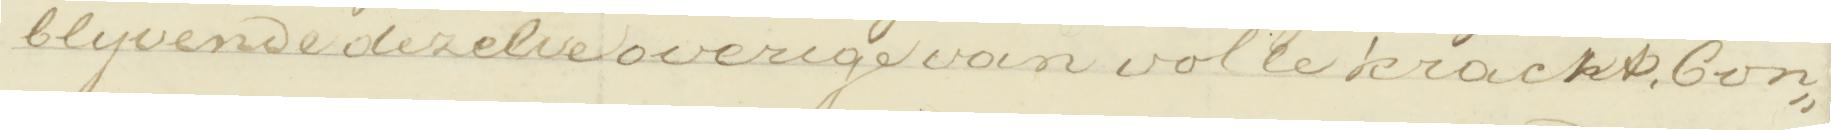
blyvende dezelve overige van volle kracht, Con„
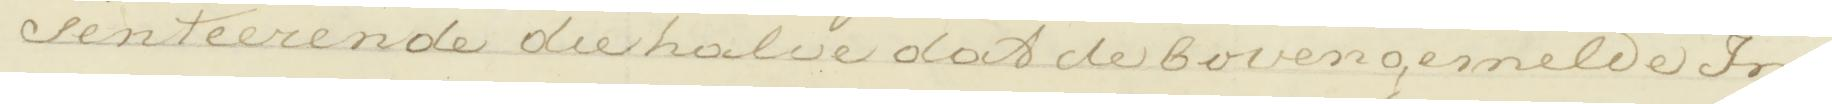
senteerende die halve dat de bovengemelde In
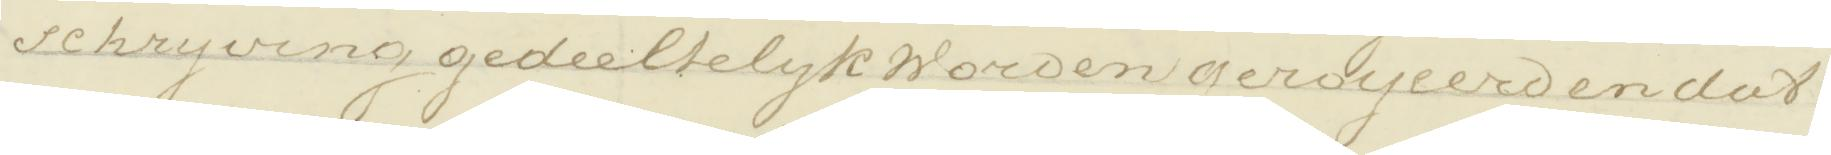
schryving gedeeltelyk worden geroyeerd en dat
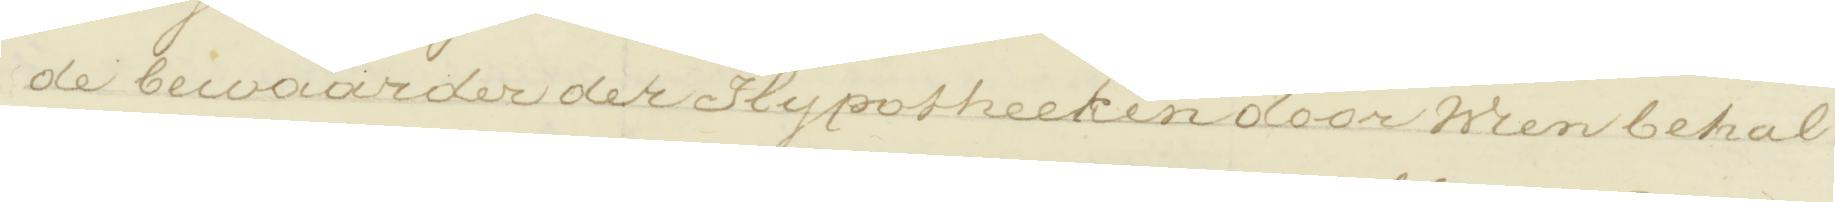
de bewaarder der Hypotheeken door wien behal
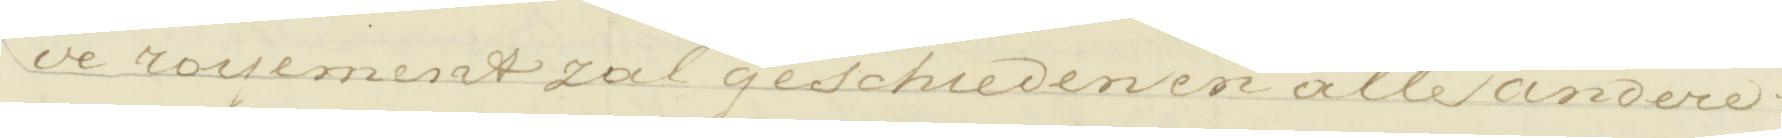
ve royement zal geschieden en alle andere
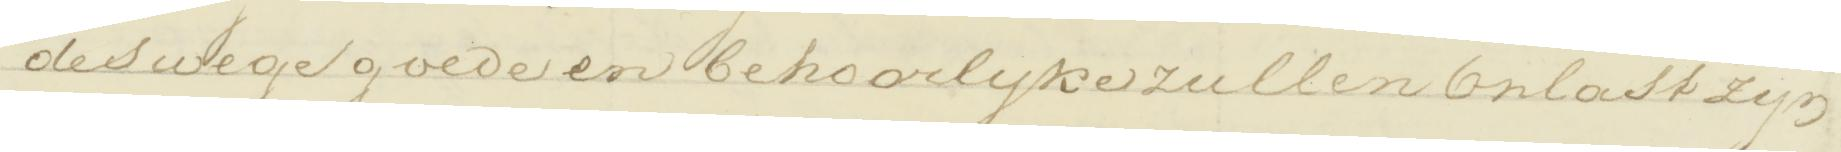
deswege goede en behoorlyke zullen onlast zyn
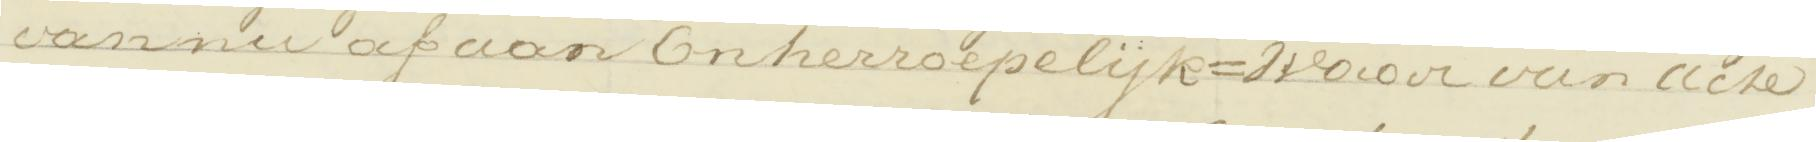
van nu af aan Onherroepelijk = Waar van acte
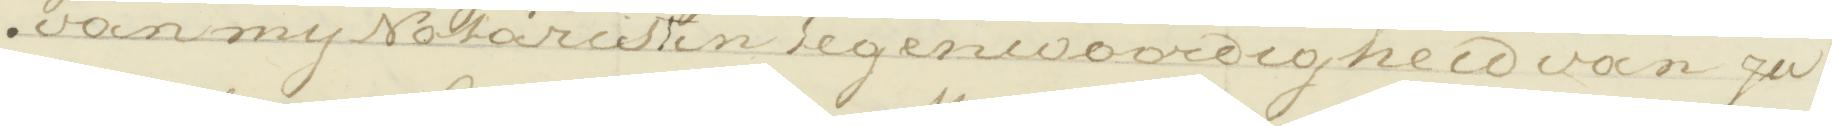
van my Notaris ¶ in tegenwoordigheid van Ja
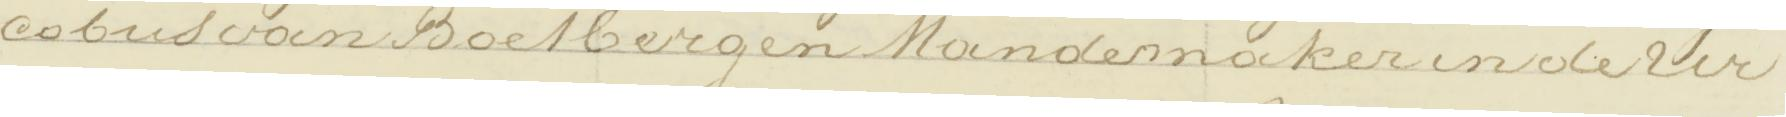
cobus van Boetbergen Mandemaker in de Ur
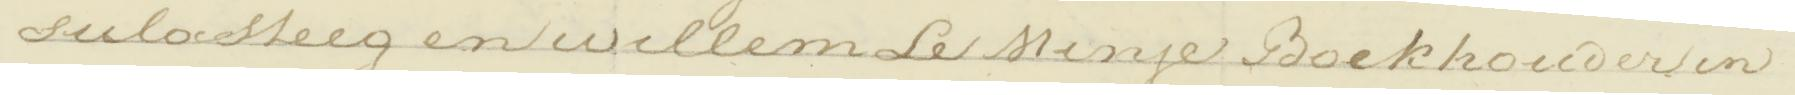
sulasteeg en Willem Le Minje Boekhouder in
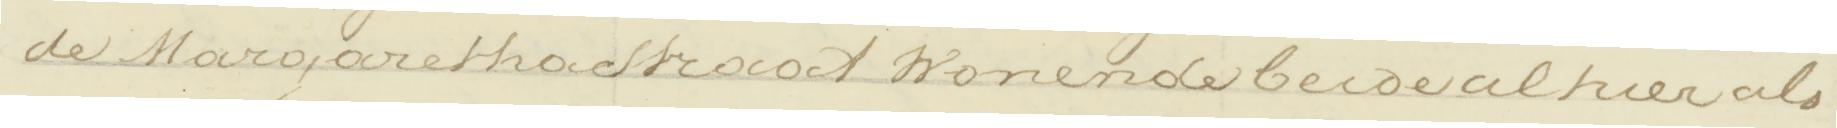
de Margaretha straat wonende beide alhier als
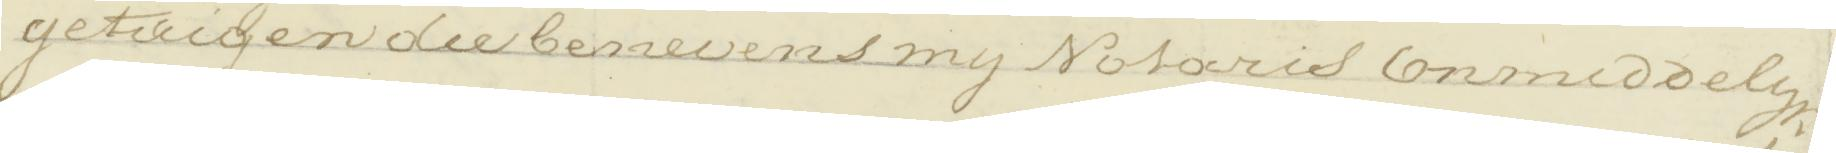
getuigen die benevens my Notaris onmiddelyk
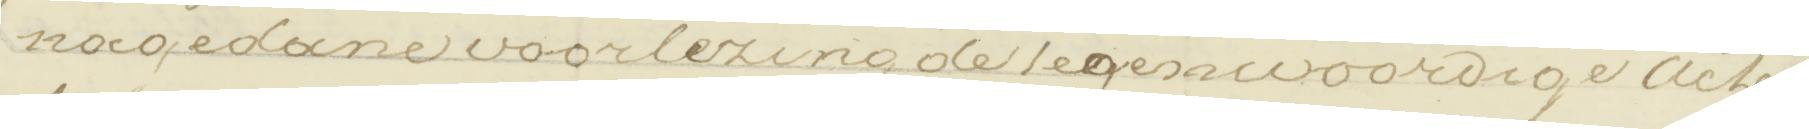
nagedane voorlezing de tegenwoordige acte
